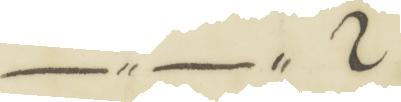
—„ — „ 2
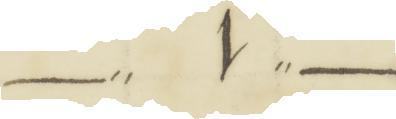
—„ 1„—
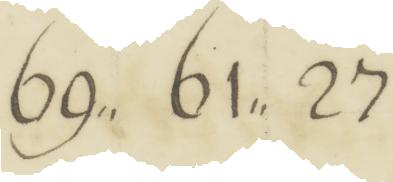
69„ 61„ 27
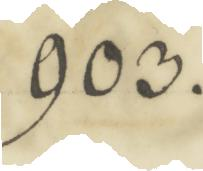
903.
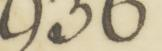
936
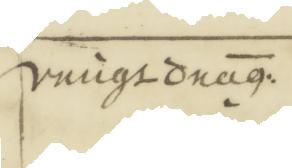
vrugtdrag:
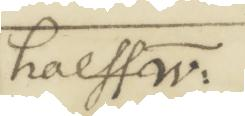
halffw:
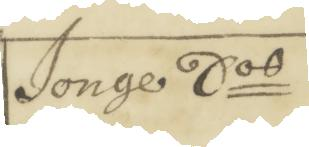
Ionge d=os
